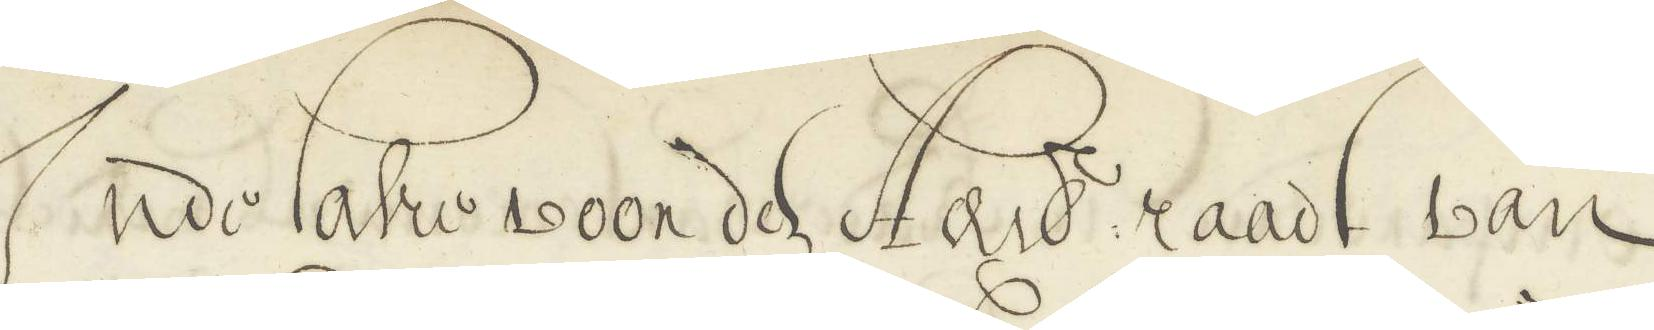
Jnde sake voor den Achtb: raadt van
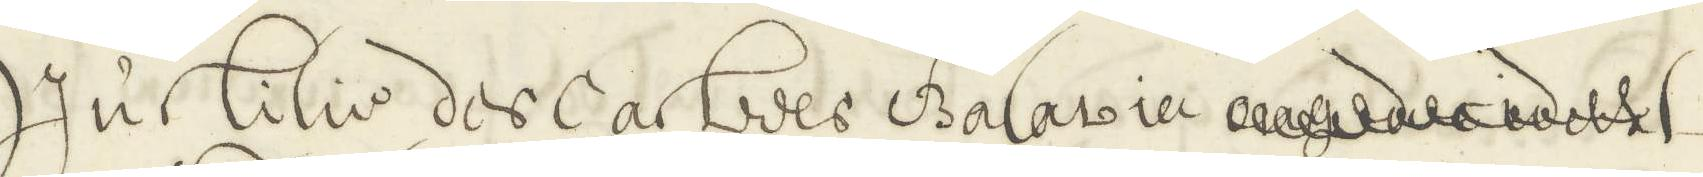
Justitie des Casteels Batavia ongedecideert
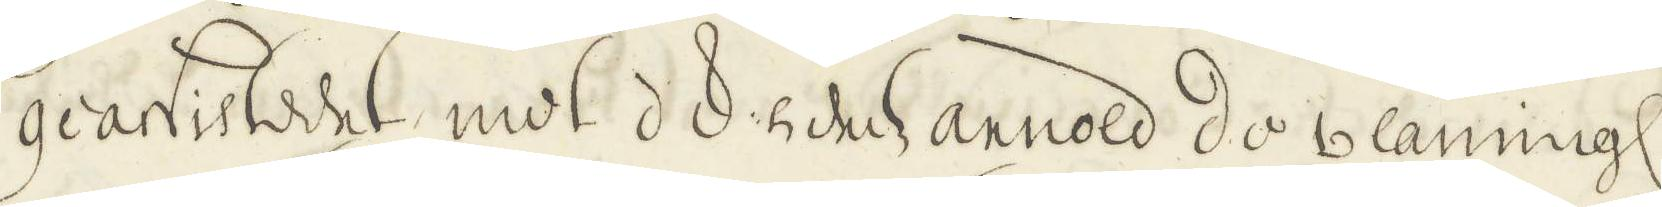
geasisteert, met d E: heren arnold de vlamingh
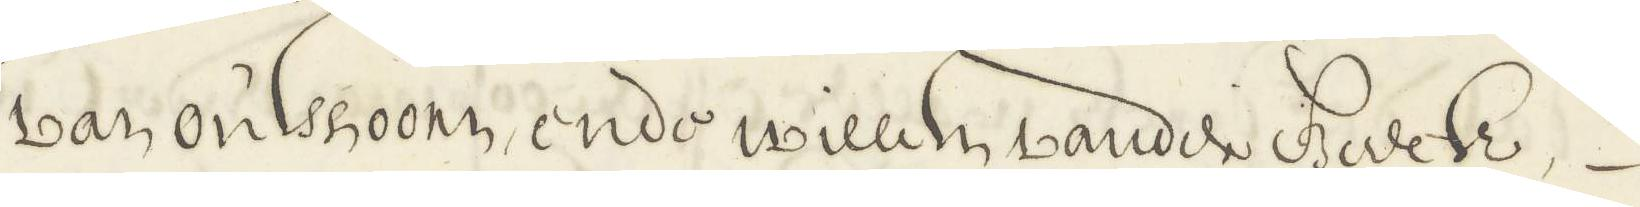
van outshoorn, ende willem vander Beeck, —
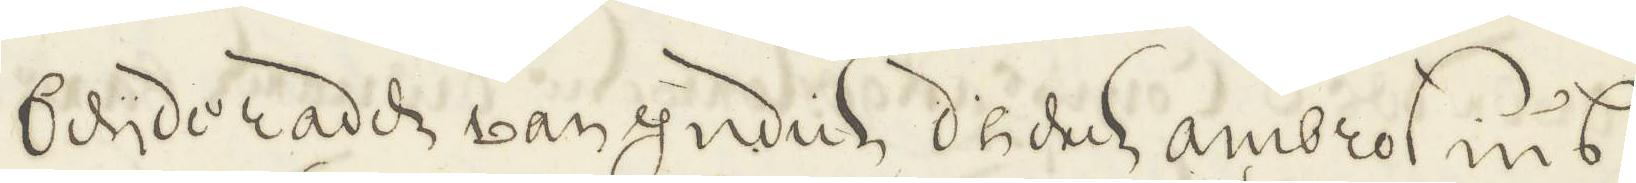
beijde raden van Jndien d’heren ambrosius
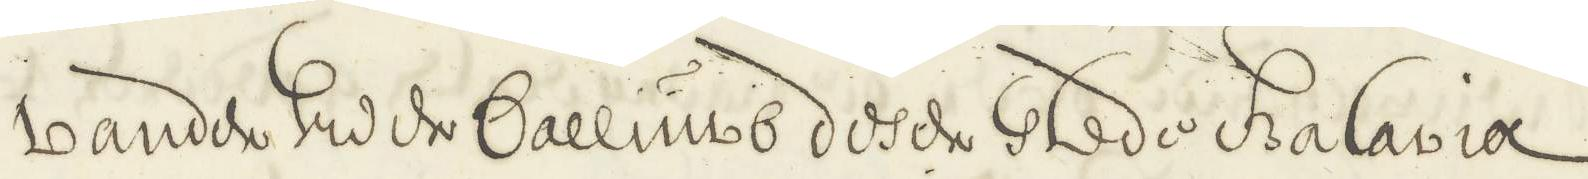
vander heer balliuw deser stede Batavia
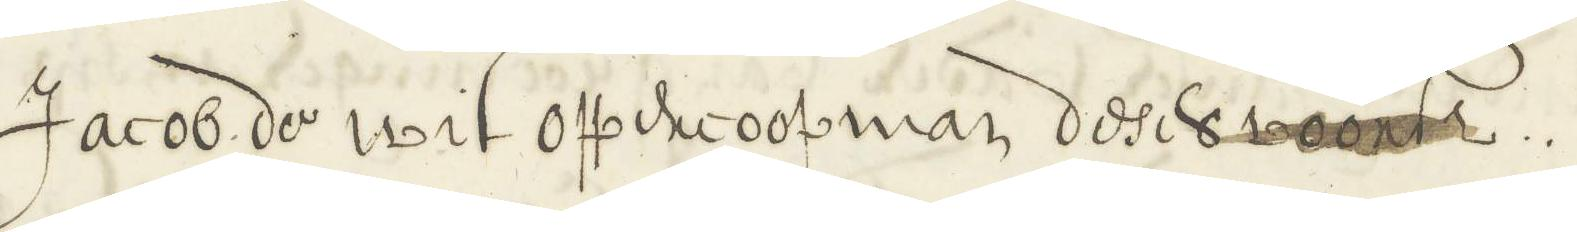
Jacob de wit oppercoopman deses voorsz..
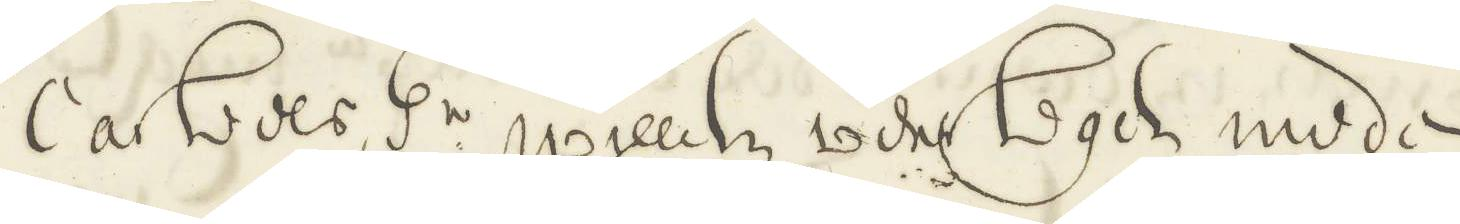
Casteels, s„r willem verstegen, mede
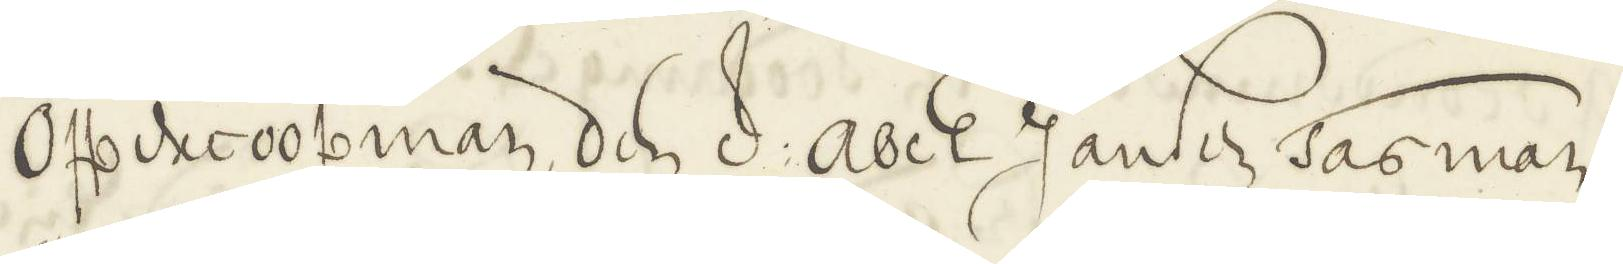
oppercoopman, den E: abel Jansen Tasman
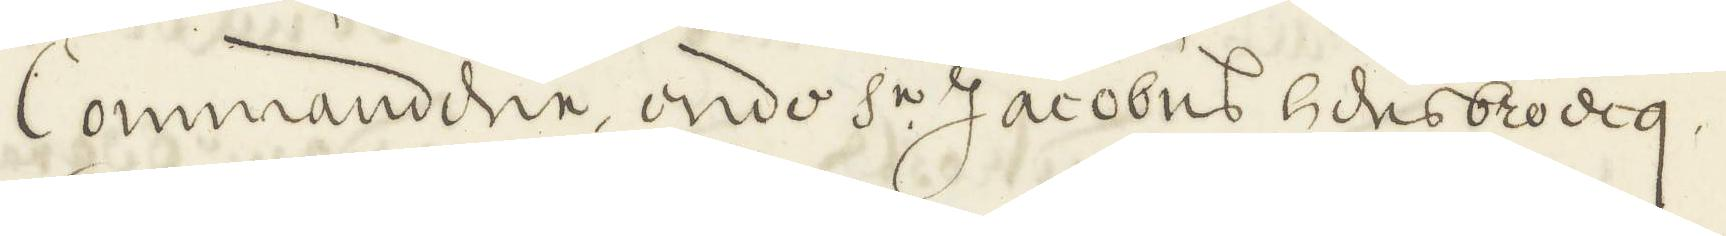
Commandeur, ende s.r Jacobus hensbroecq,
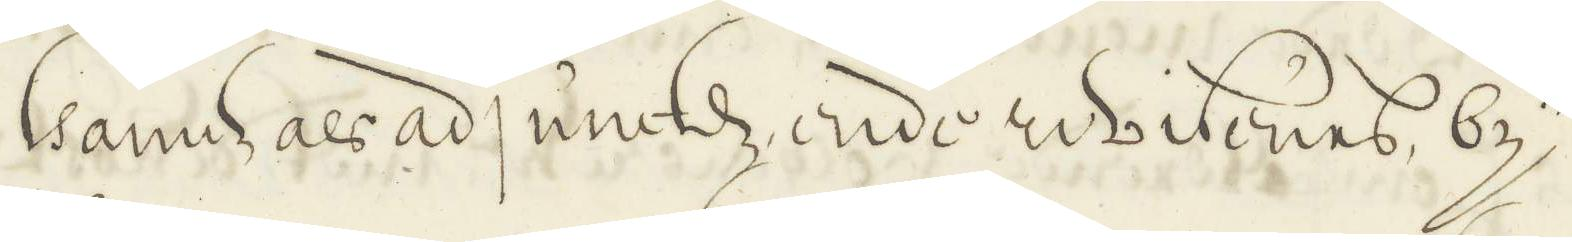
tsamen als adjuncten, ende reviseurs, bij
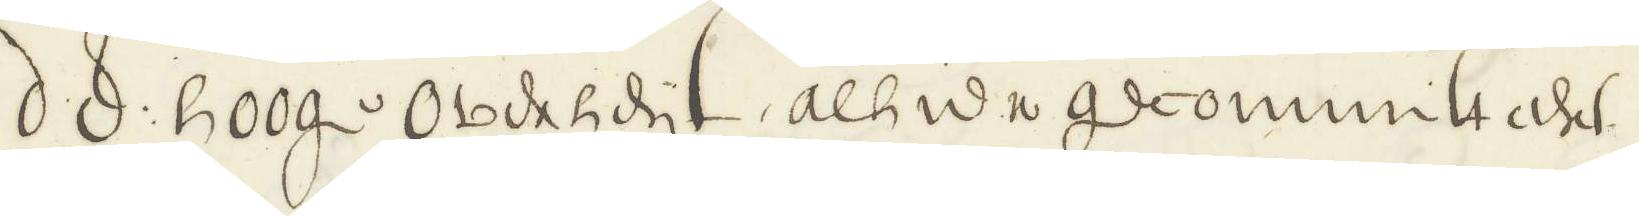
d’ E: hooge overheijt, alhier gecommitteert
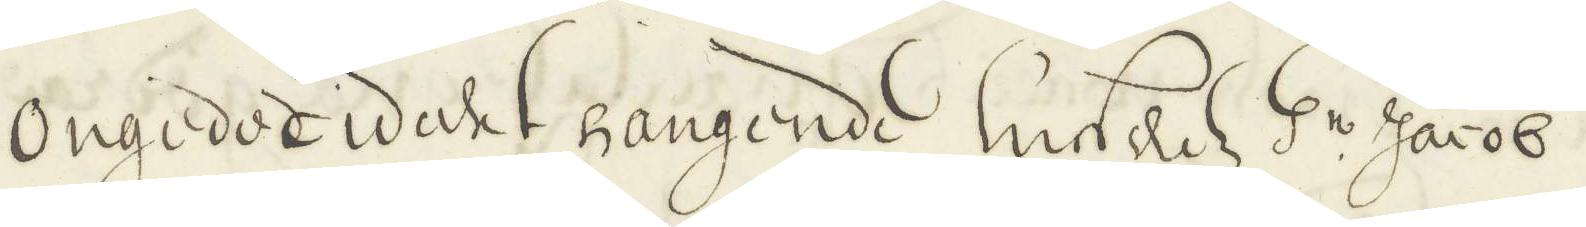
ongedecideert hangende tuschen s.r Jacob
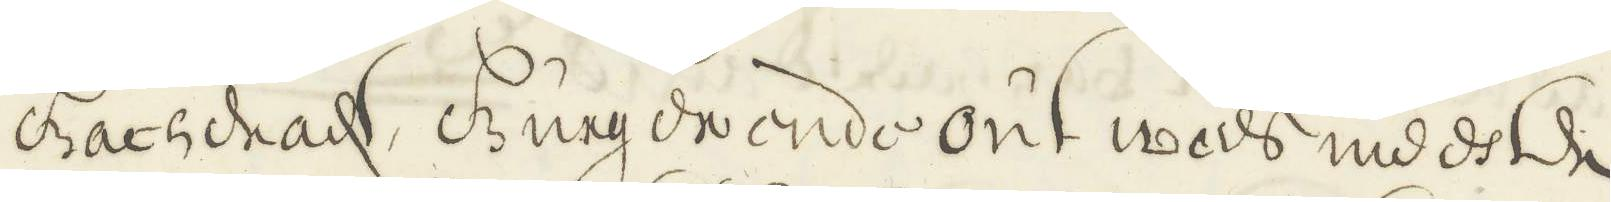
Bacheraet, Burger ende out wees meester
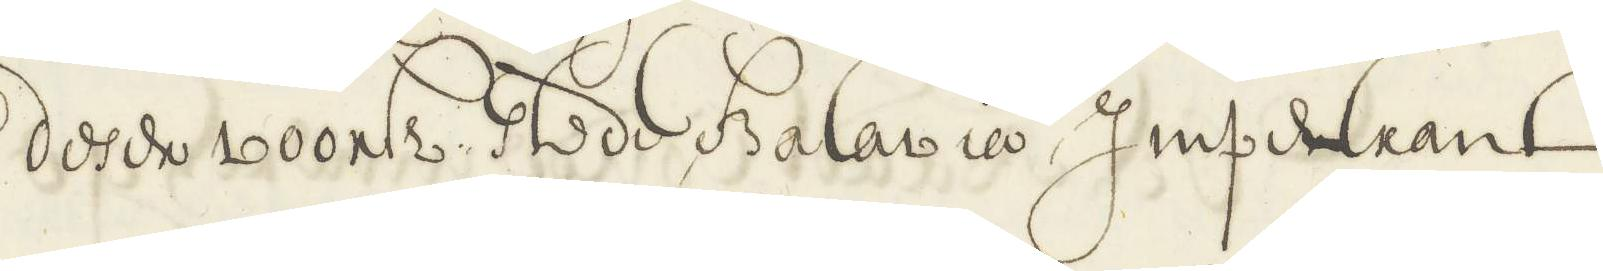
deser voorsz: stede, Batavia, Jmpertrant
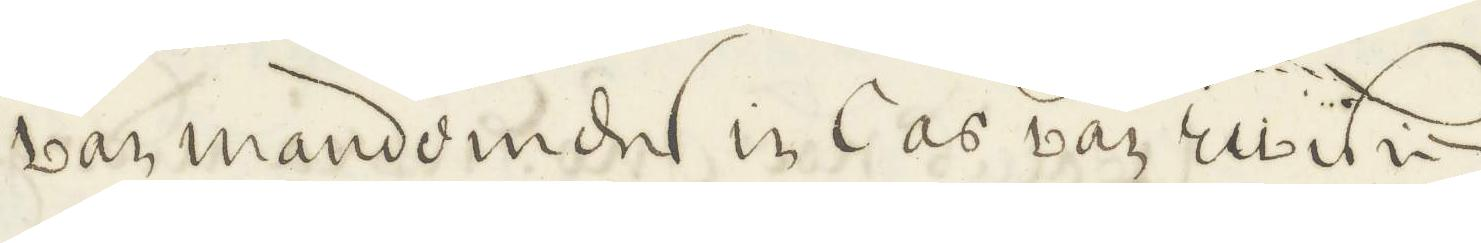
van mandement in Cas van rivisie
